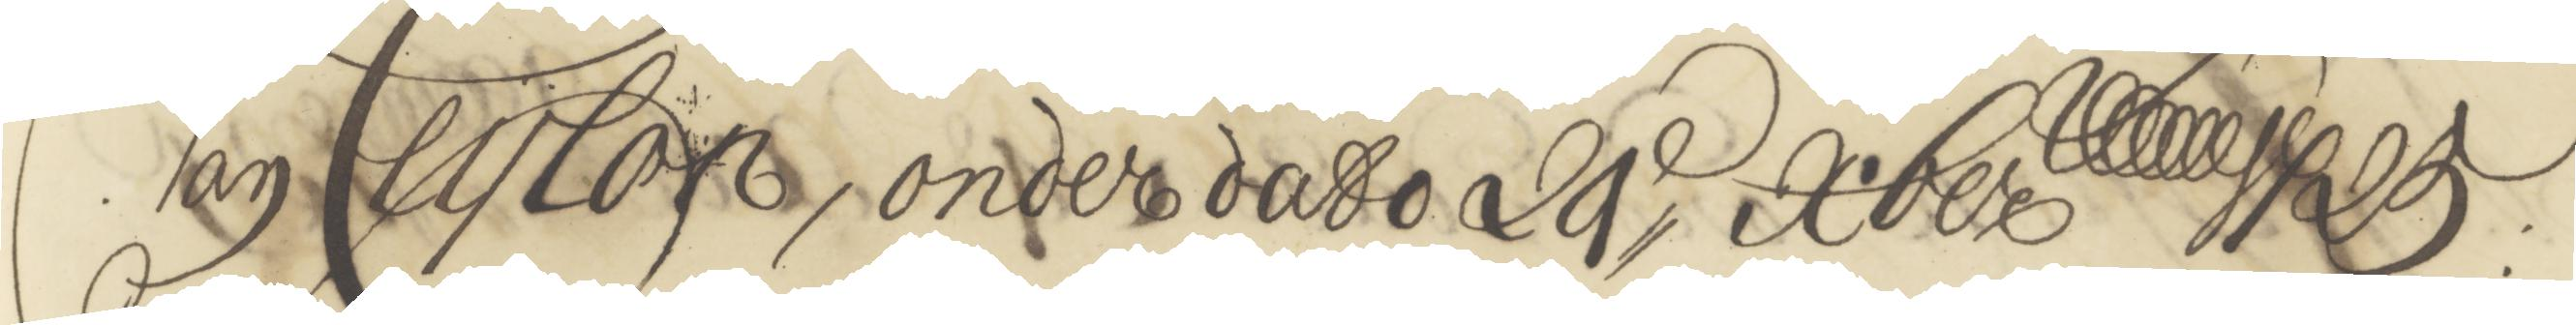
Van Ceijlon, onder dato 24„e xber 1725:
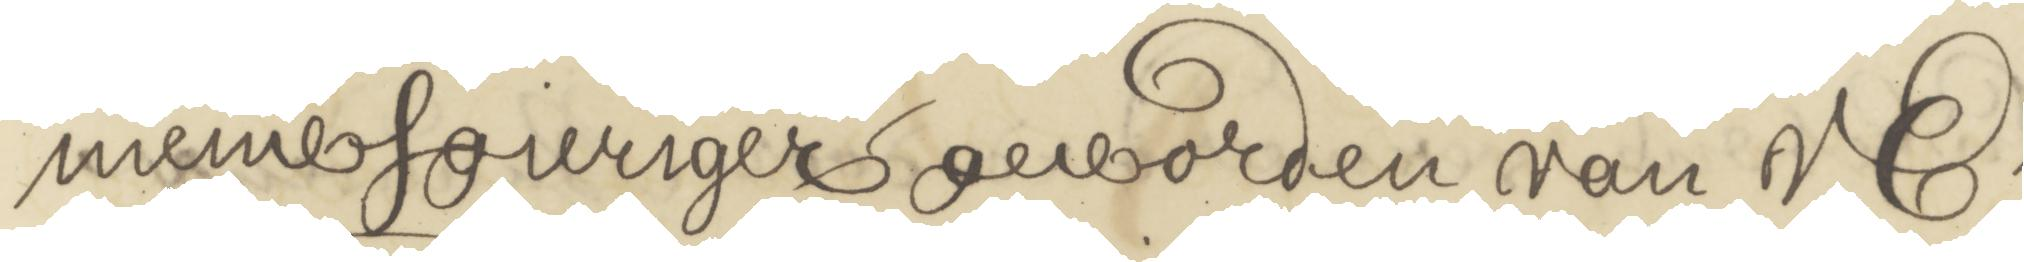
nieuwsgieriger geworden van VE:
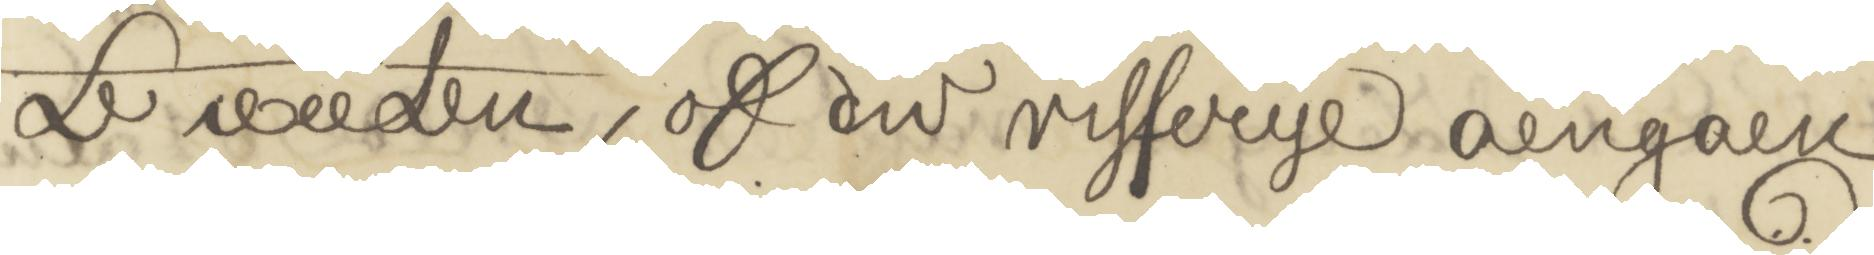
te weeten, of die visserije aengaen
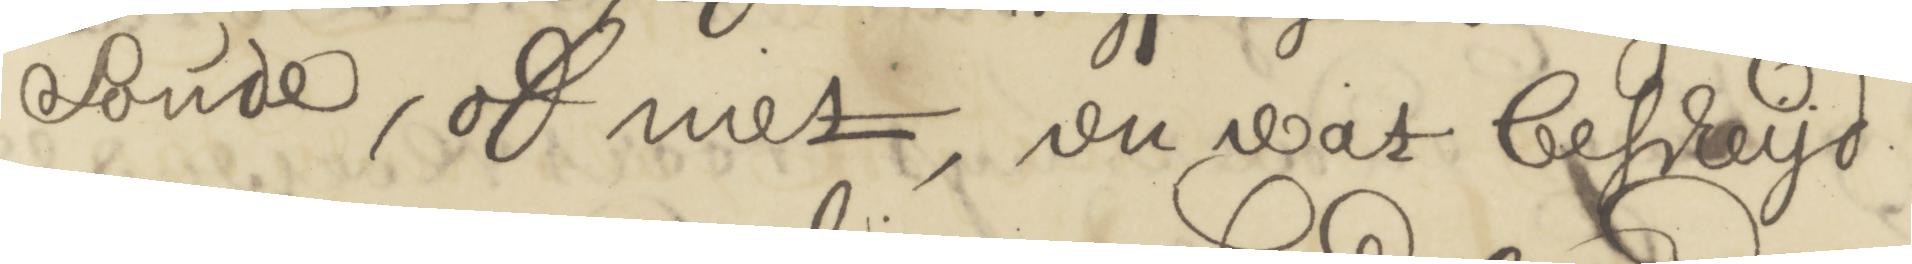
soude, of niet, en wat bescheijd.
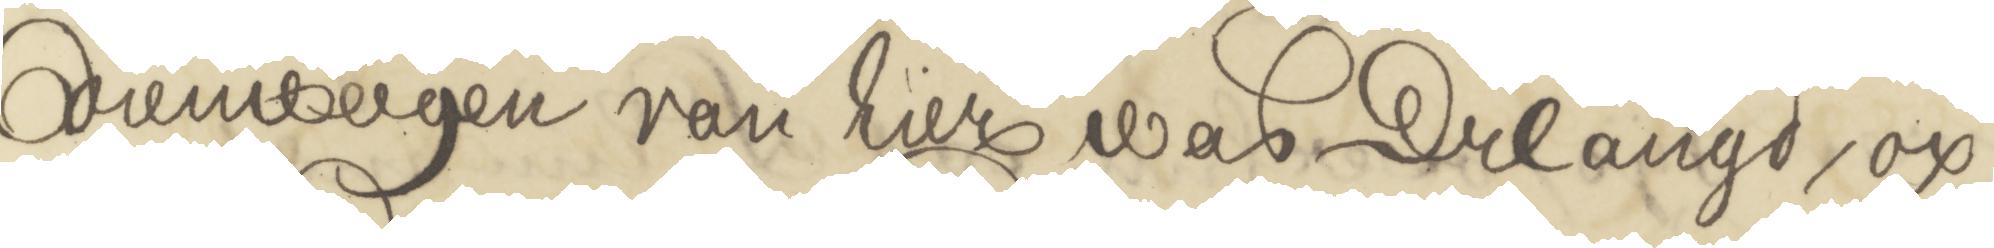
dientweegen van hier was Erlangd, op
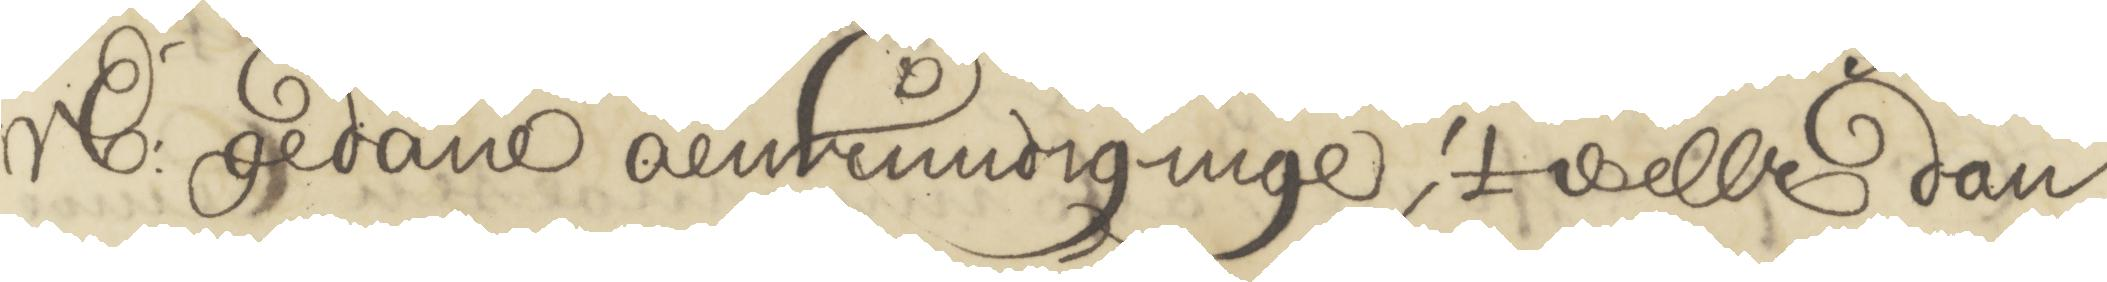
VE: gedane aenkundiginge, ’t welk dan
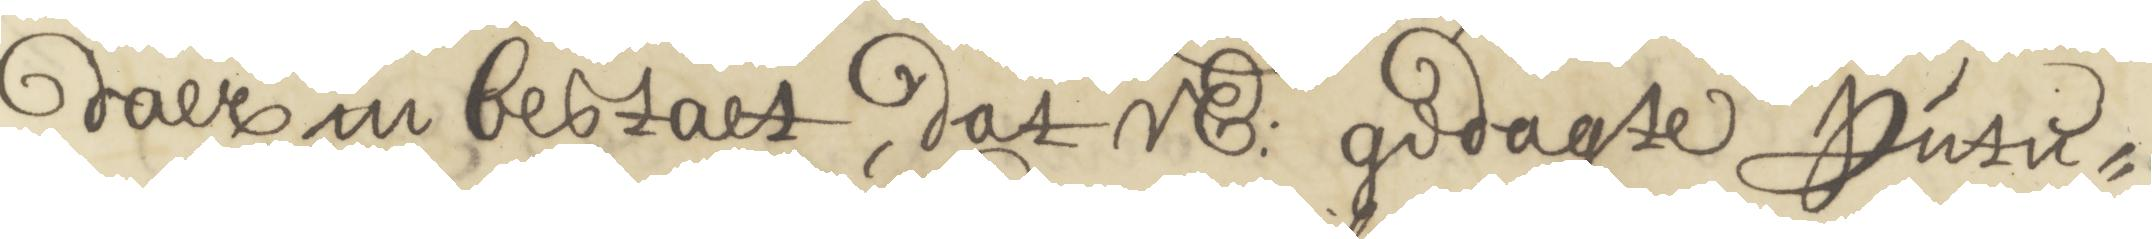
daer in bestaet, dat VE: gedagte putu„
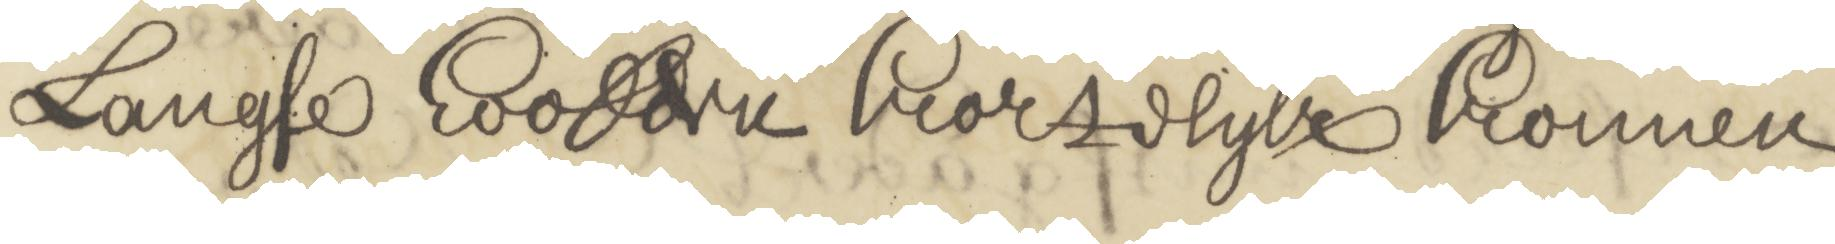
langse hoofden kortelijk konnen
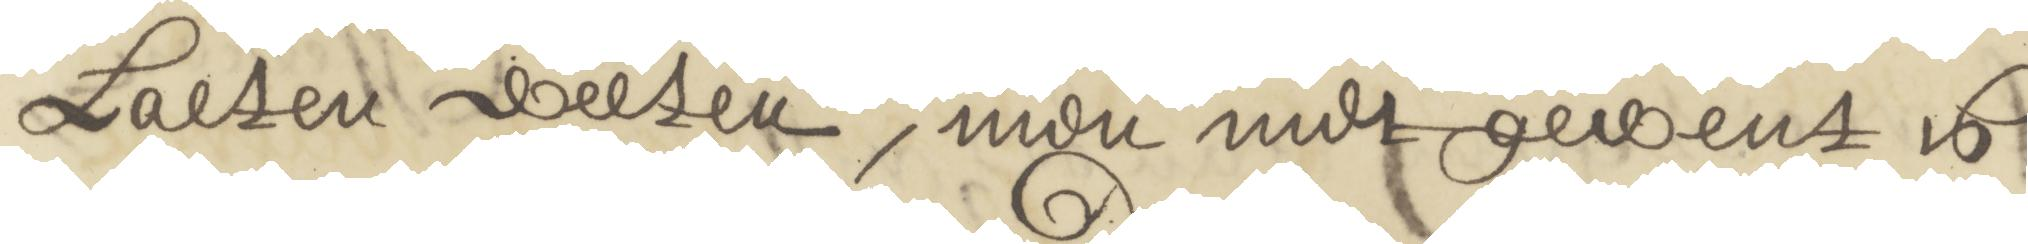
laeten weeten, men niet gewent is
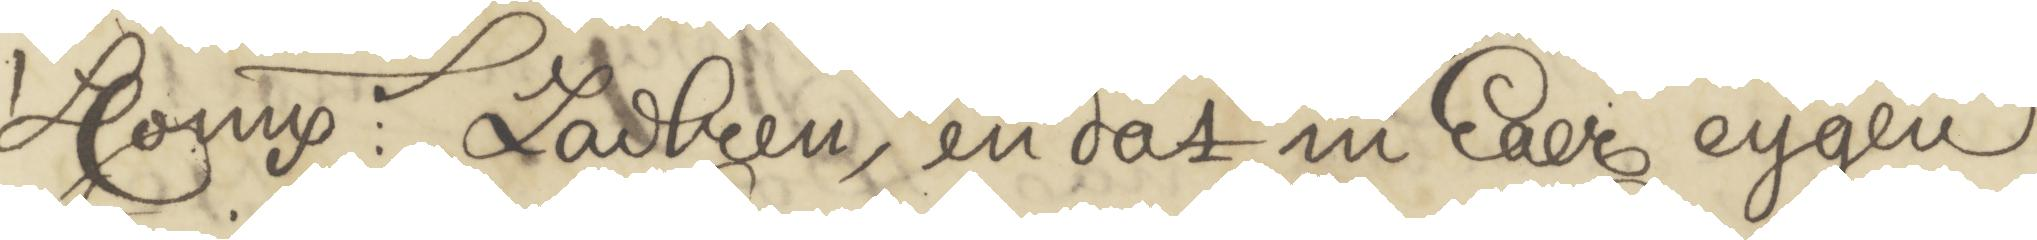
'sComp:s zaeken, en dat in haer eijgen
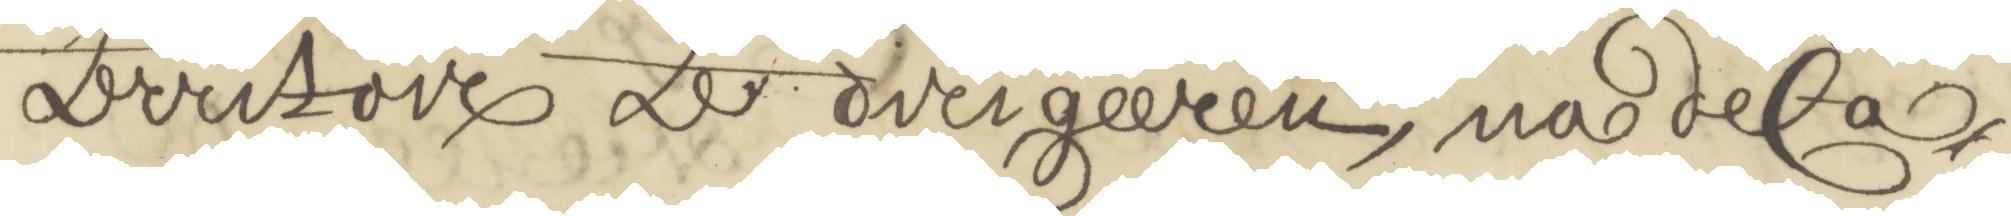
territoir te dirigeeren, na de Ca
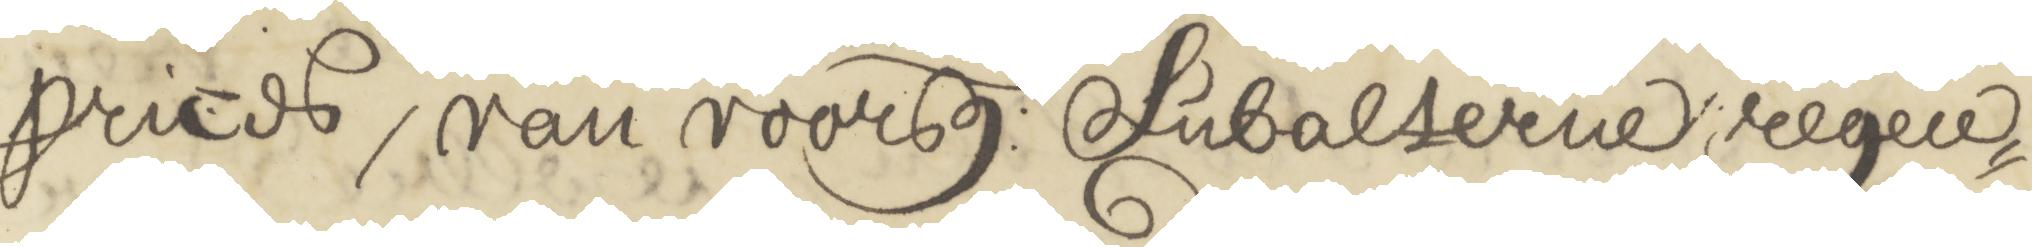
prices, van voors: Subalterne: regen„
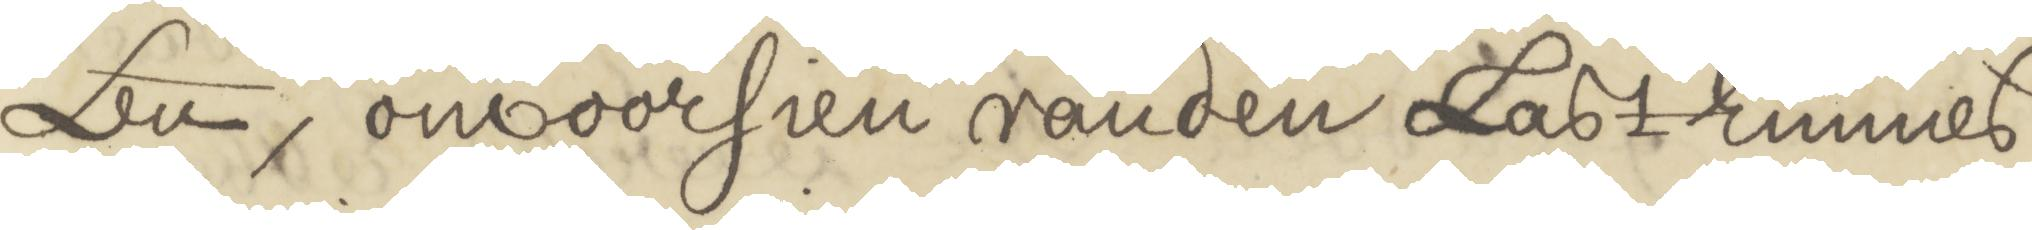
ten onvoorsien van den last hunnes
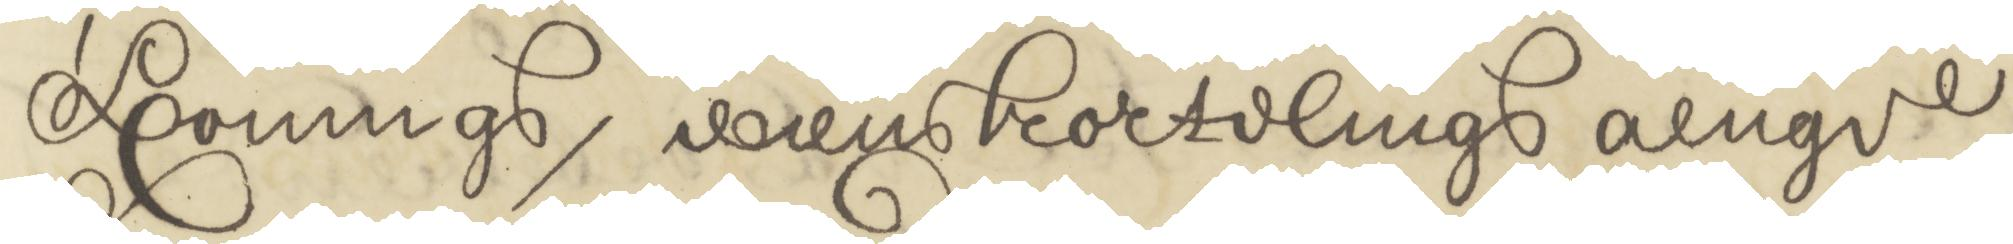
'SConings, wiens kortelings aenge
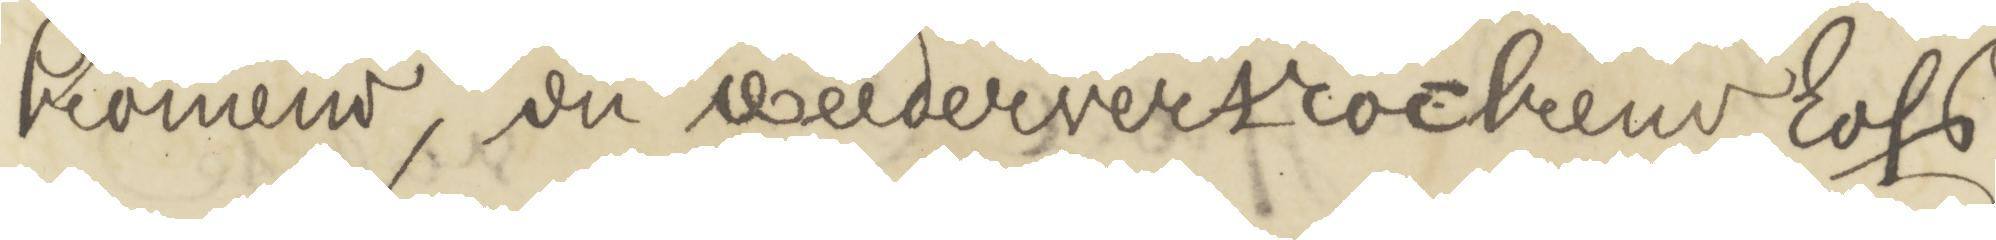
komene, en weedervertrockene hofs
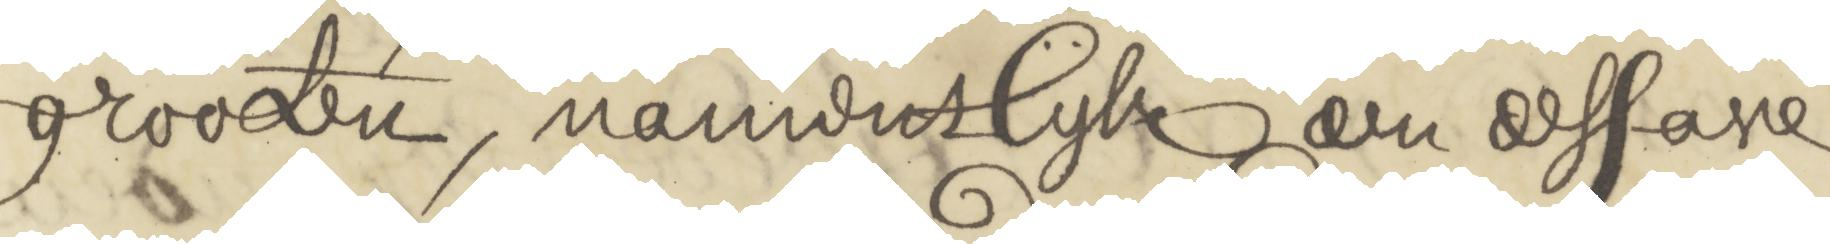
grooten, namentlijk den dessave
